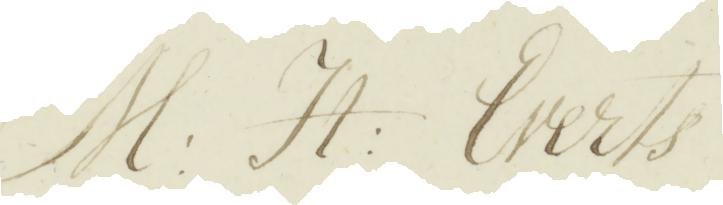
M: H: Everts
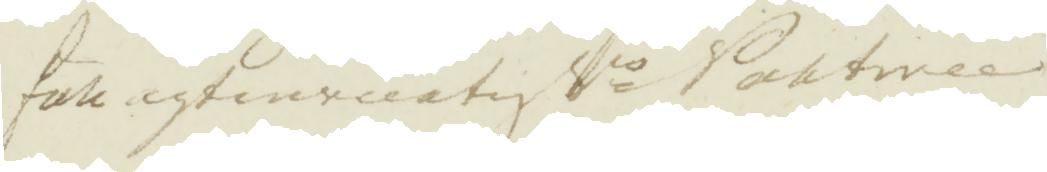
fak agtenveertig V=o Vak twee
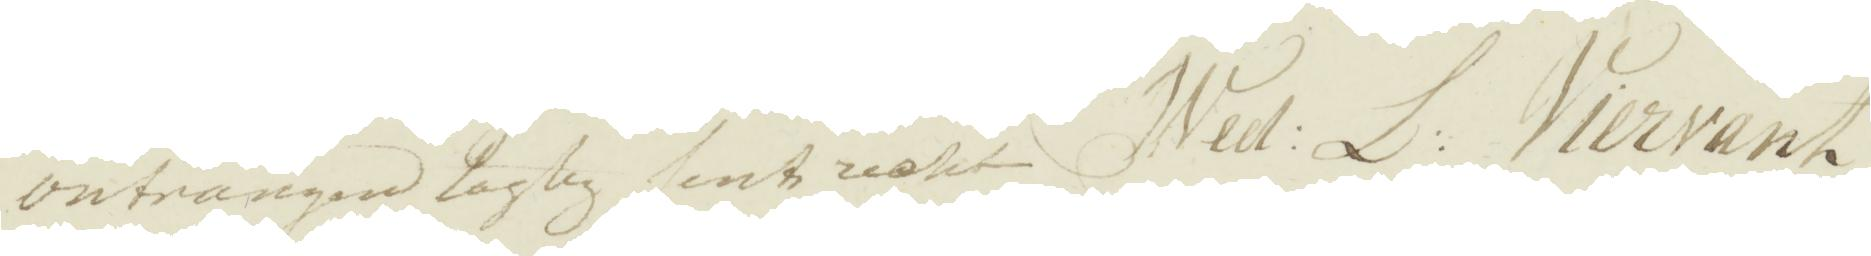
ontvangen tagtig Cents recht Wed: L: Viervant
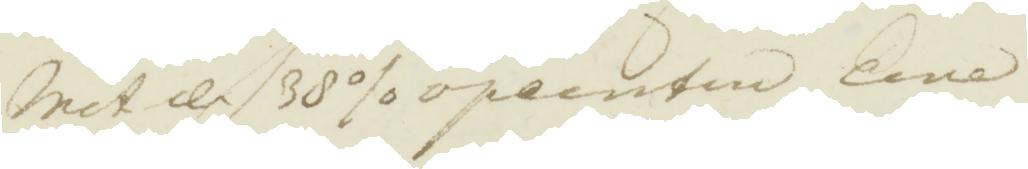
met de 38% opcenten Eene
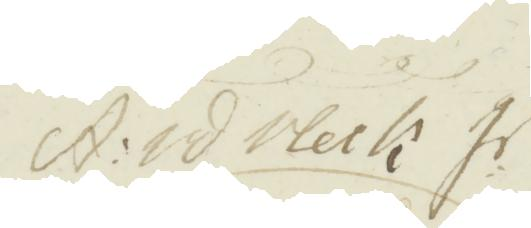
A: vd Vlerk J=r
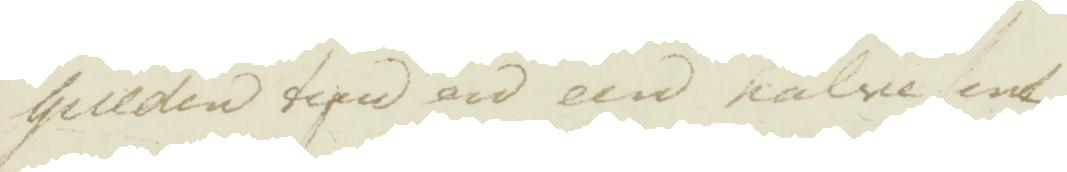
Gulden tien een een halve Cent
